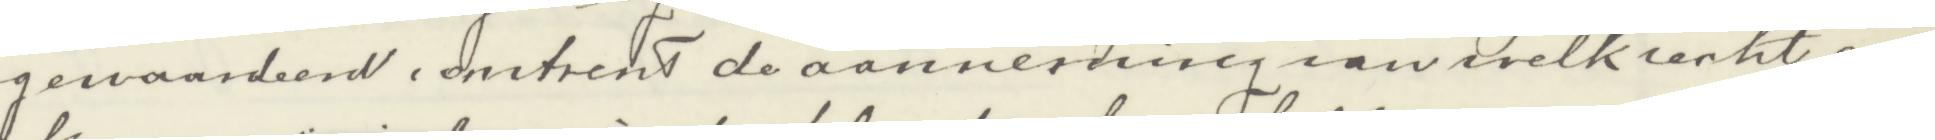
gewaardeerd, omtrent de aanneming van welk recht en
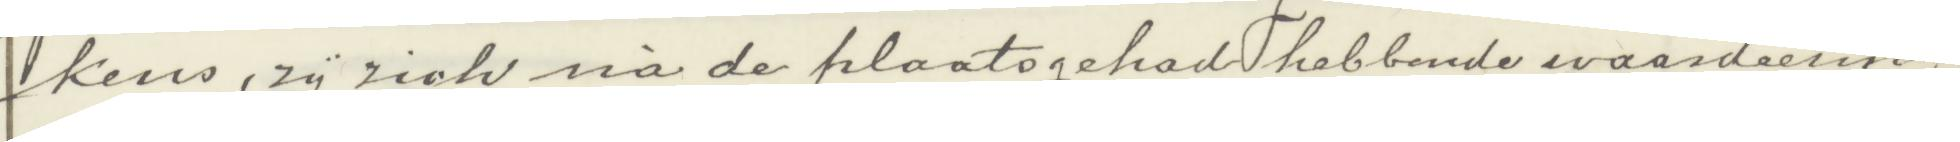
keus, zij zich na de plaatsgehad hebbende waardeering
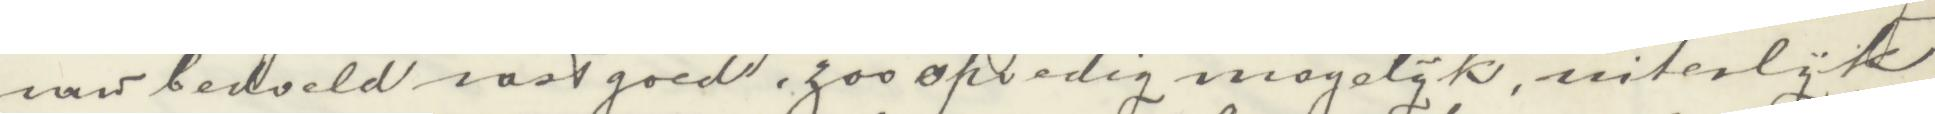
van bedoeld vastgoed, zoo spoedig mogelijk, uiterlijk
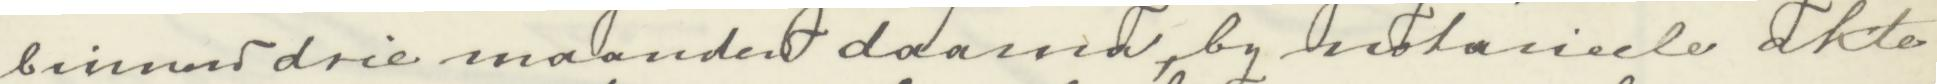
binnen drie maanden daarna, by notarieele akte
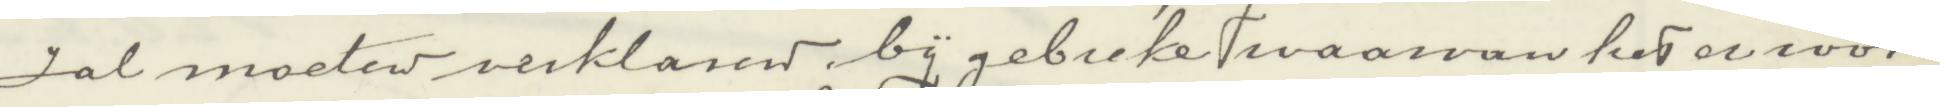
zal moeten verklaren bij gebreke waarvan het er voor
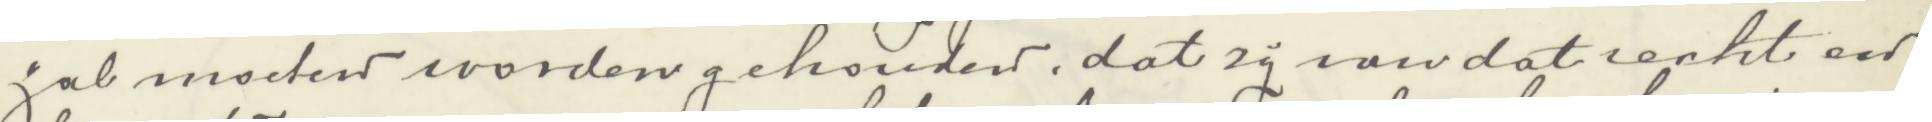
zal moeten worden gehouden, dat zij van dat recht en
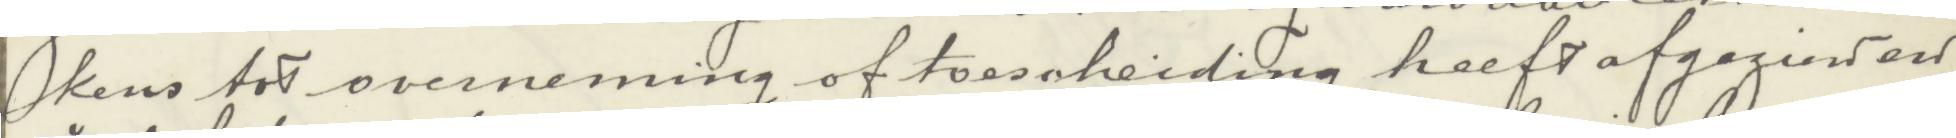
keus tot overneming of toescheiding heeft afgezien en
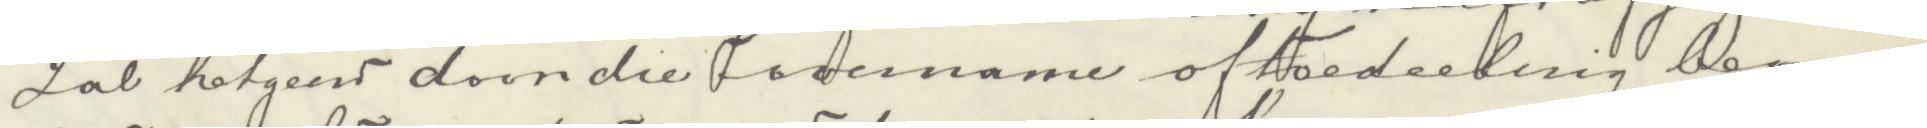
zal hetgeen door die overname of toedeeling bevon
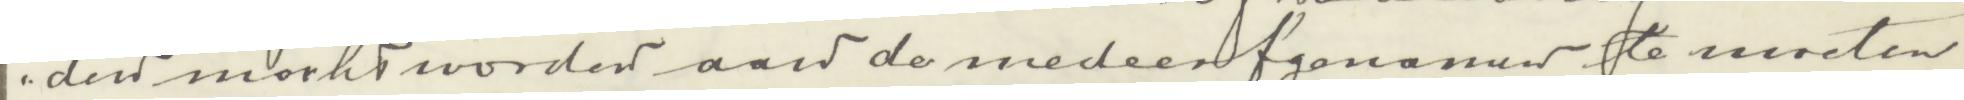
„den mocht worden aan de medeerfgenamen te moeten
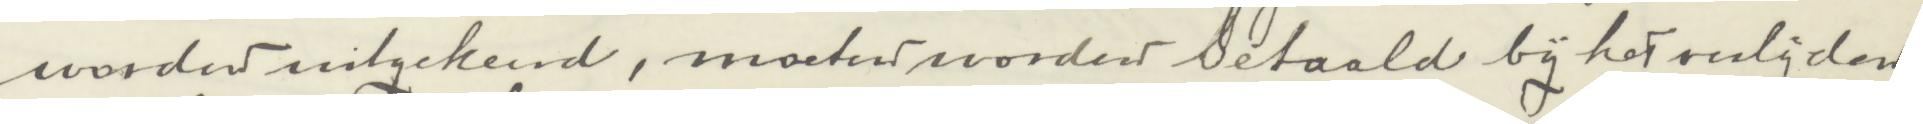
worden uitgekeerd, moeten worden betaald bij het verlijden
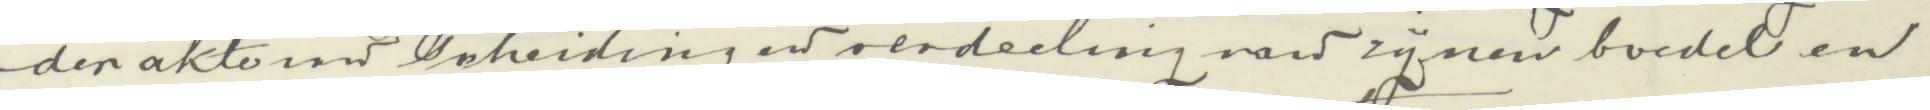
der akte van scheiding en verdeeling van zijnen boedel en
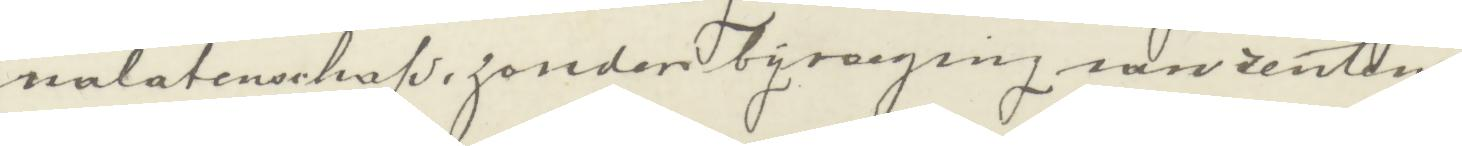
nalatenschap, zonder bijvoeging van renten
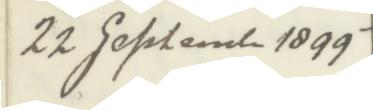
22 september 1899
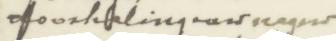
doorhaling van negen
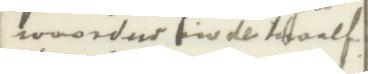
woorden in de taalf
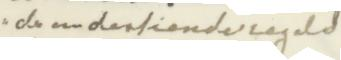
„de en dertiende regels
